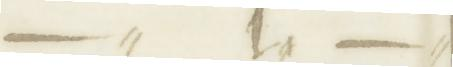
—„1„—„
